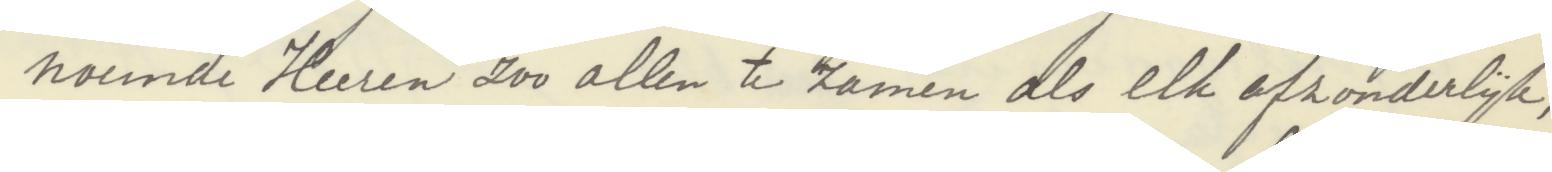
noemde Heeren zoo allen te zamen als elk afzonderlijk,
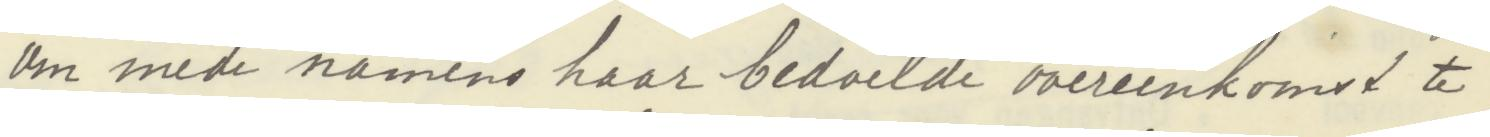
om mede namens haar bedoelde overeenkomst te
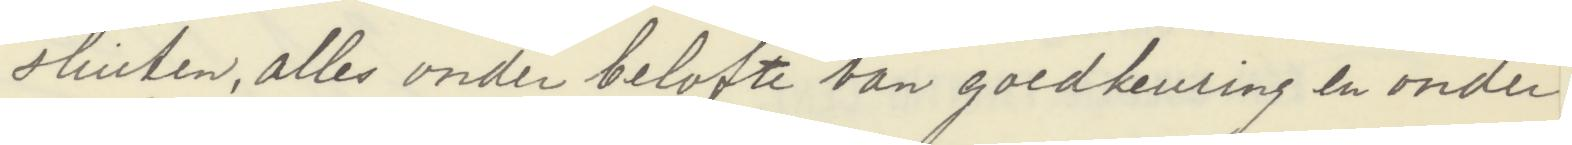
sluiten, alles onder belofte van goedkeuring en onder
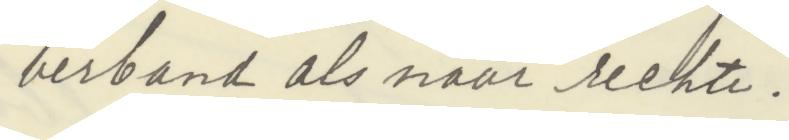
verband als naar rechte.
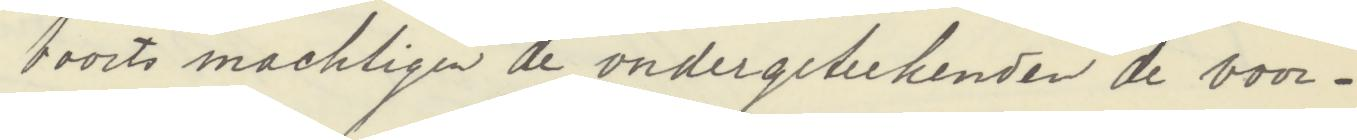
Voorts machtigen de ondergeteekenden de voor-
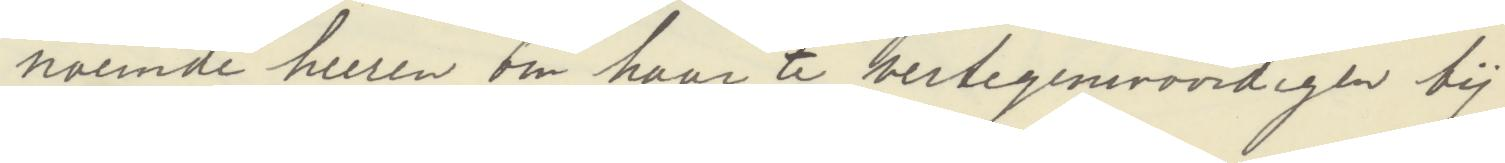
noemde heeren om haar te vertegenwoordigen bij
